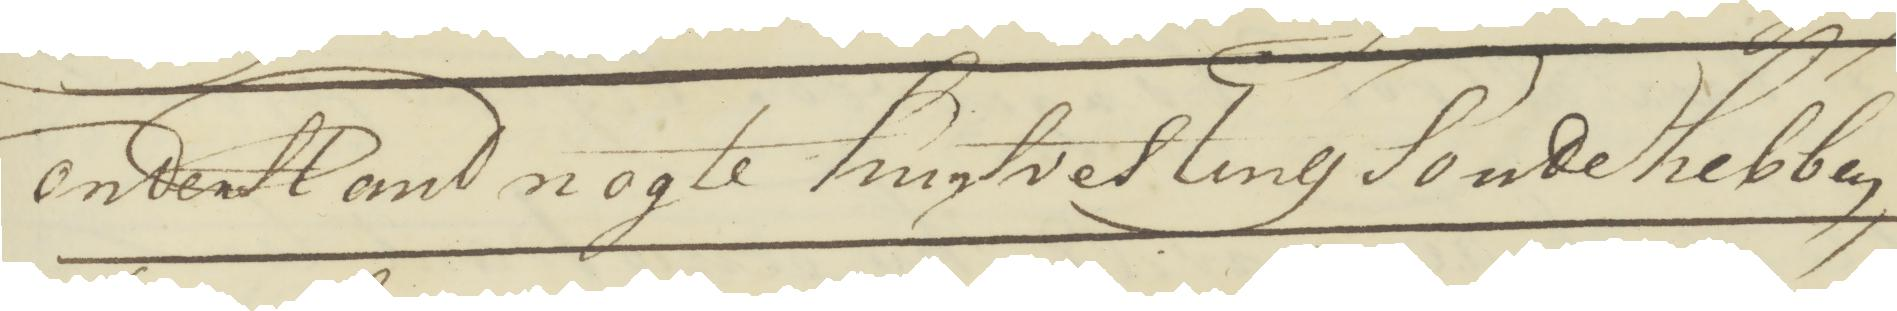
onderstand nog te huysvesting soude hebben,
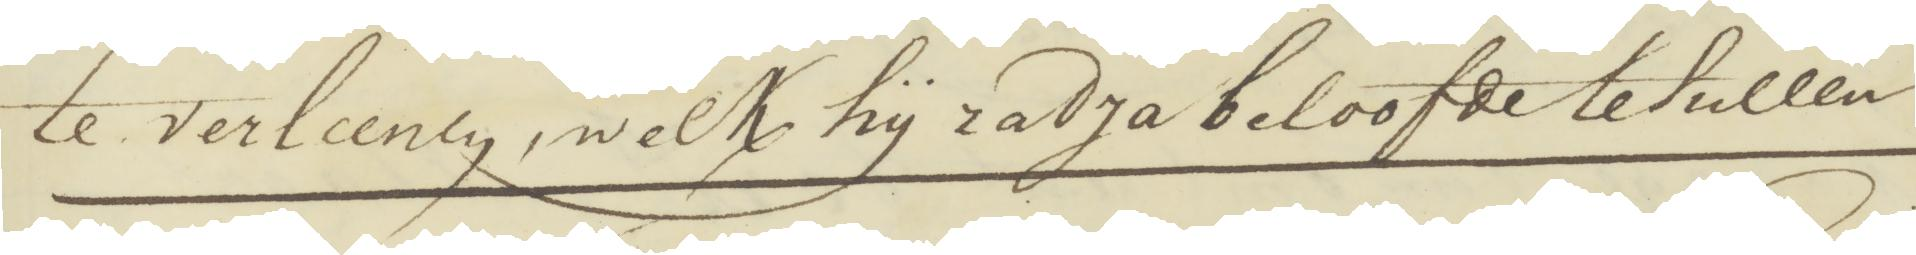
te verleenen, welk hij radja beloofde te sullen
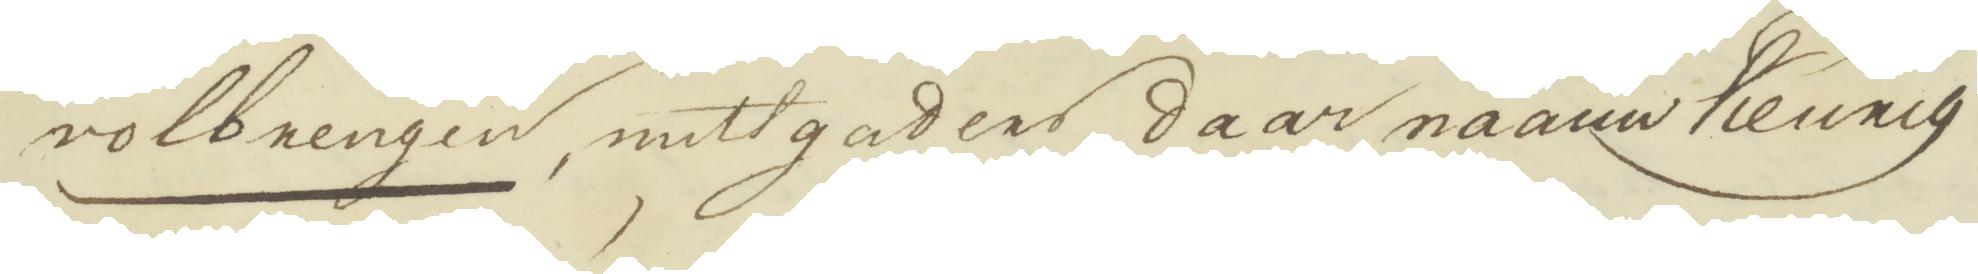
volbrengen, mitsgaders daar naauwkeurig
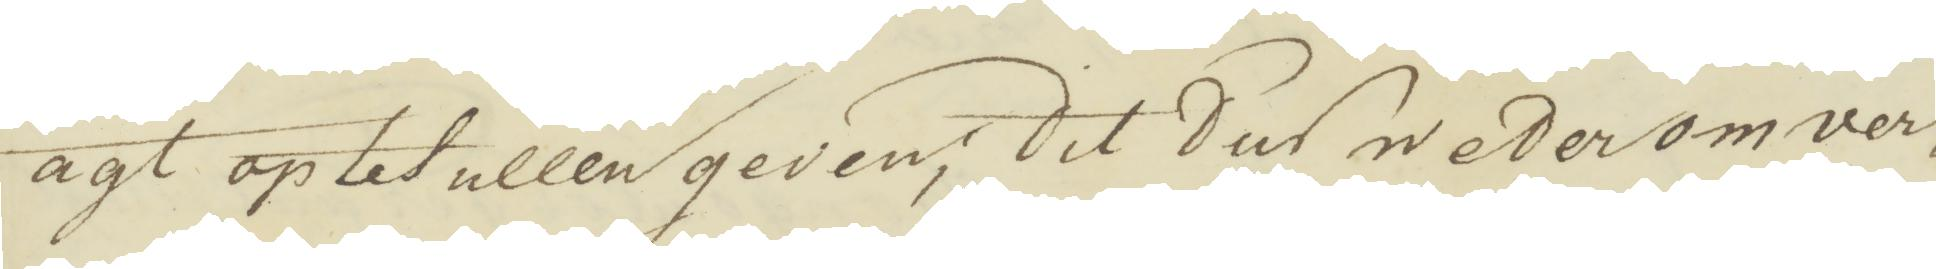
agt op te sullen geven; dit dus weder om ver
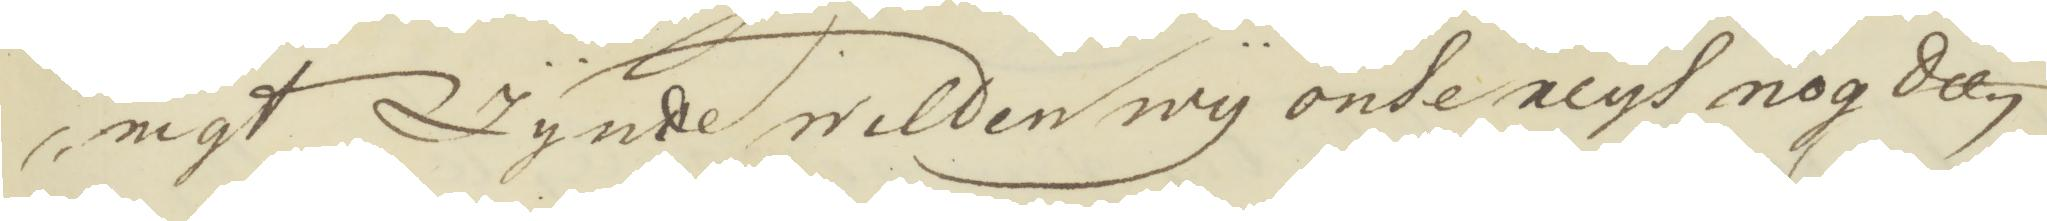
„rigt zijnde wilden wij onse reijs nog dien
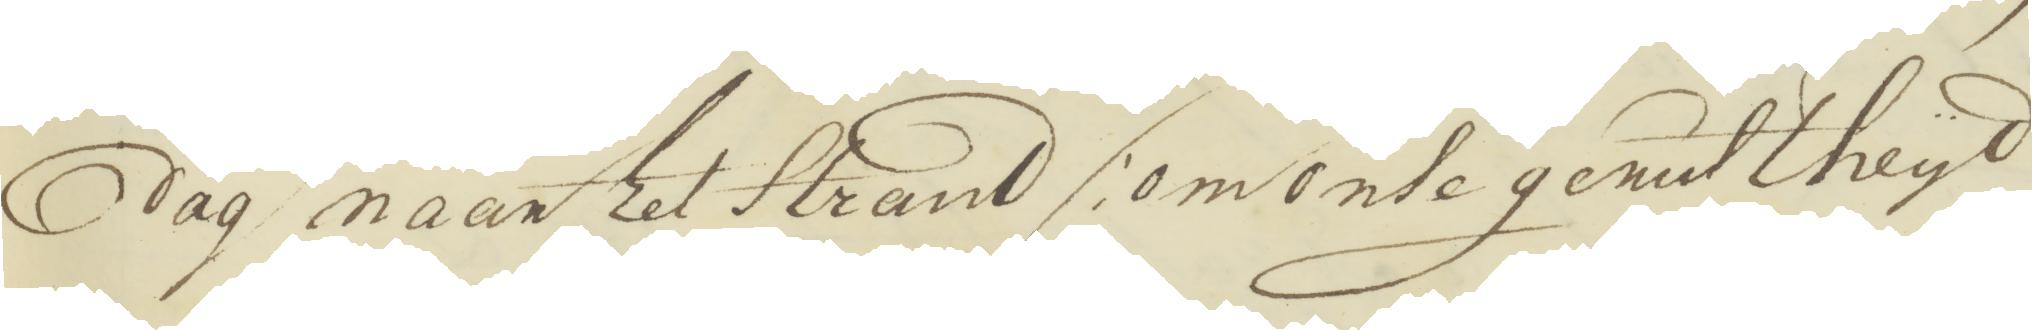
dag naar het strand /: om onse gerustheijd
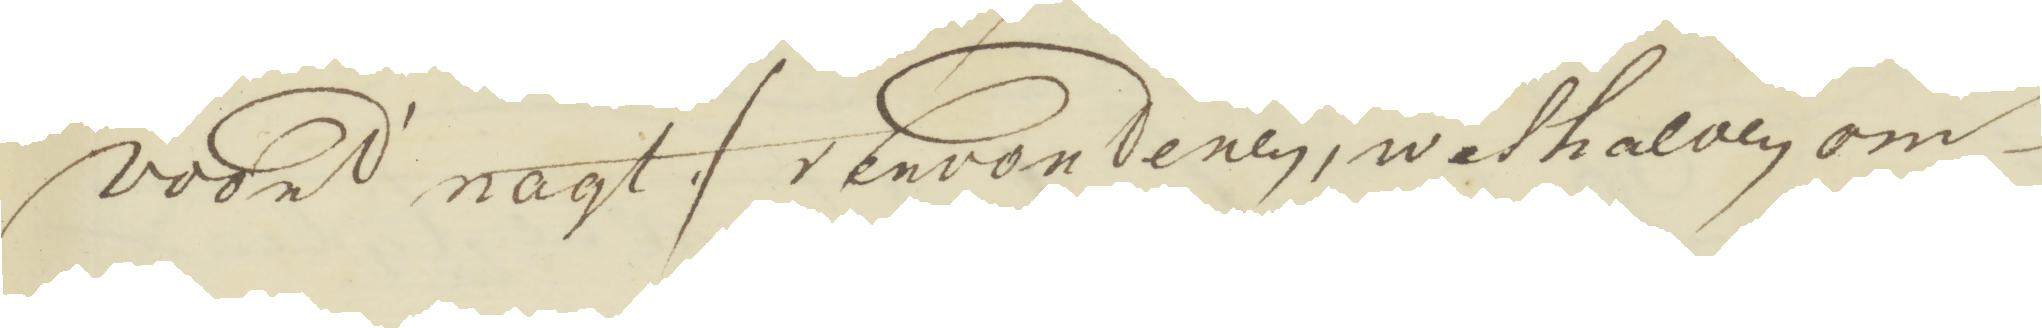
voor d' nagt :/ vervorderen, weshalven om _
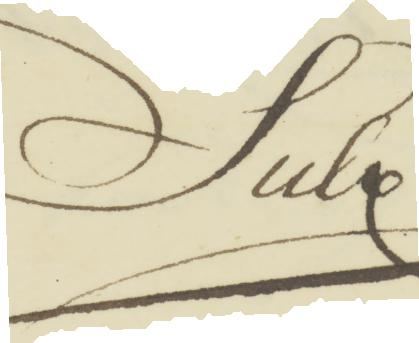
Sulx
